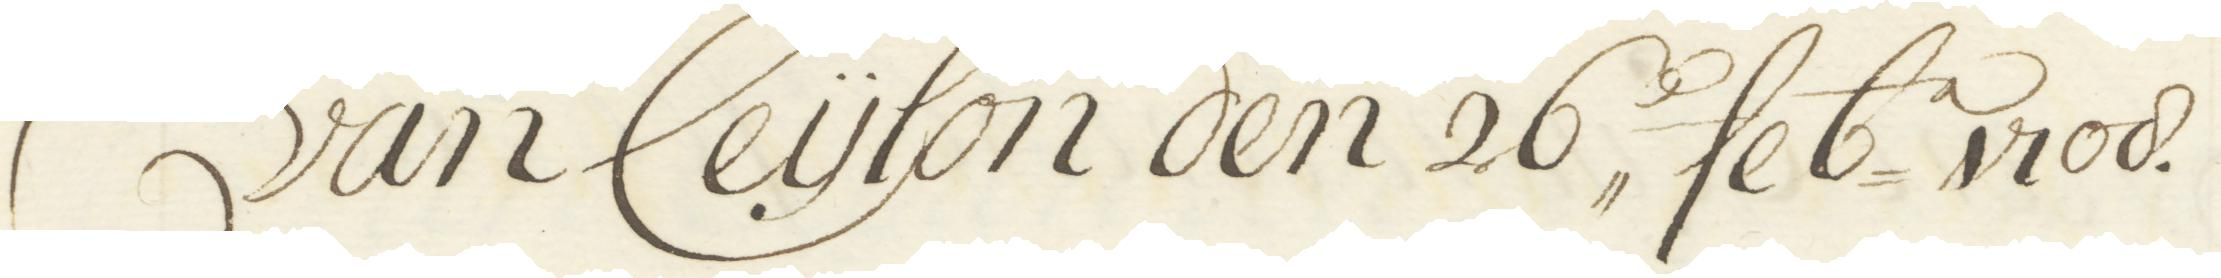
van Ceijlon den 26„e feb=r 1708.
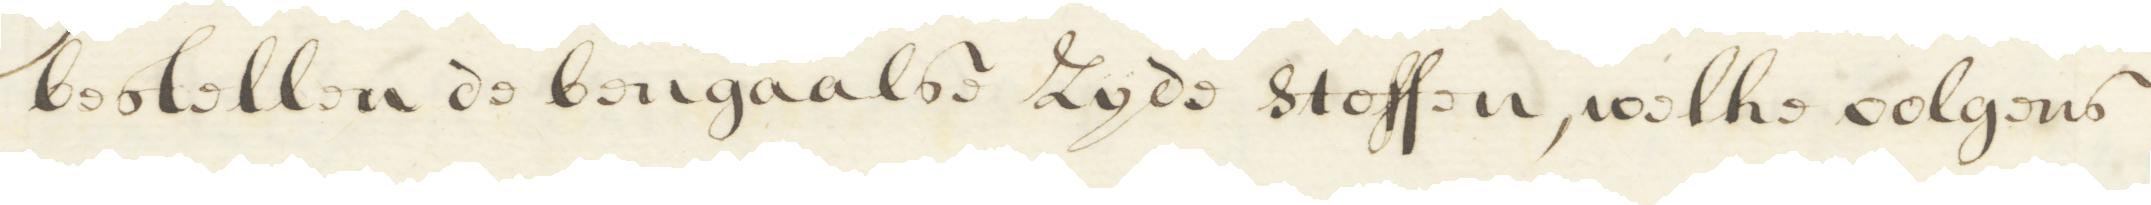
bestellen de bengaalse zijde stoffen, welke volgens
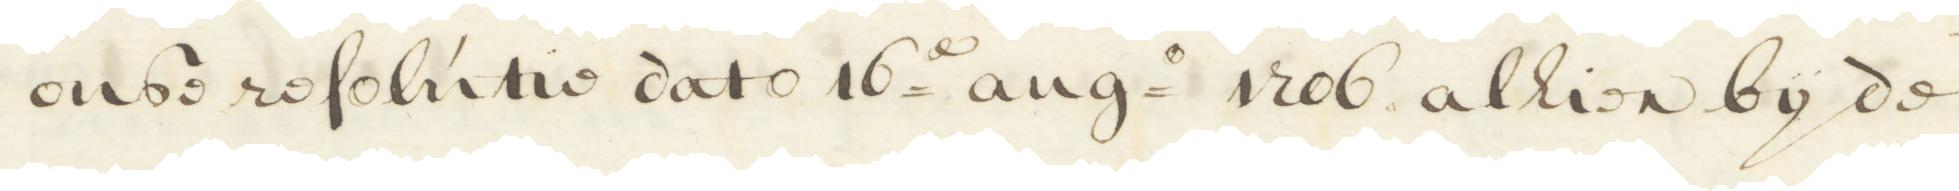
onse resolutie dato 16=e aug=o 1706 alhier bij de
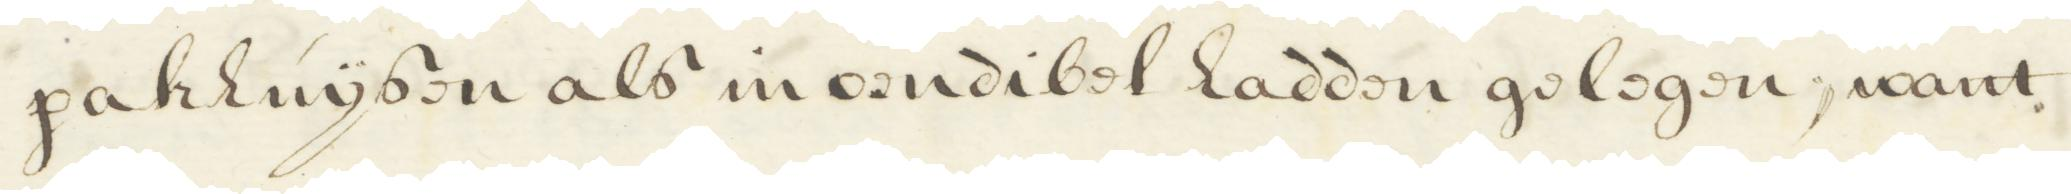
pakhuijsen als in vendibel hadden gelegen, want
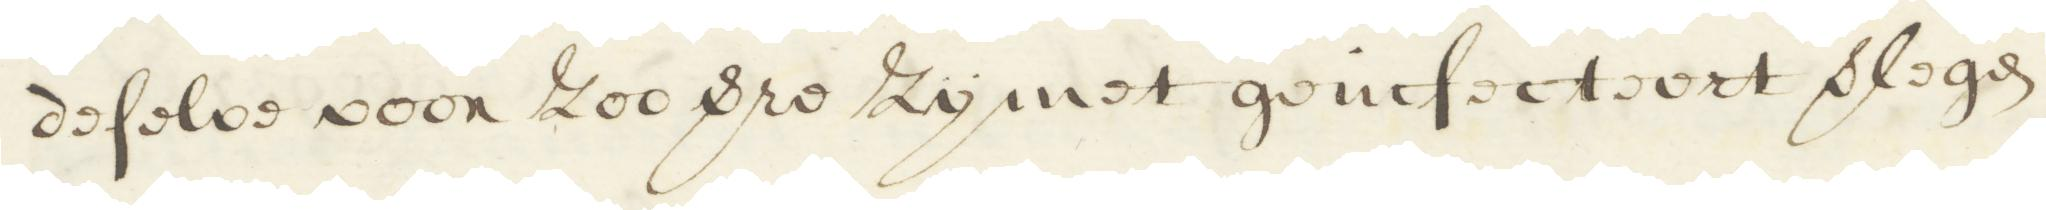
deselve voor zoo verre zijniet geinfecteert verlegen
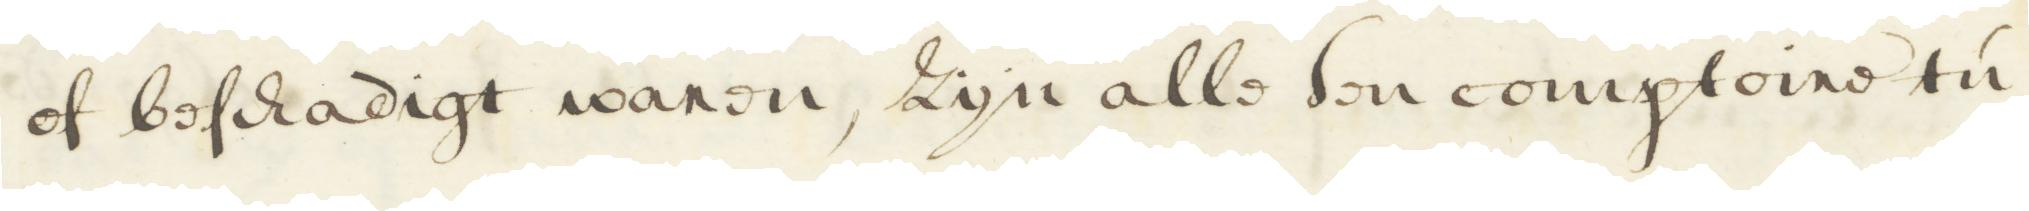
of beschadigt waren, zijn alle ten comptoire tu
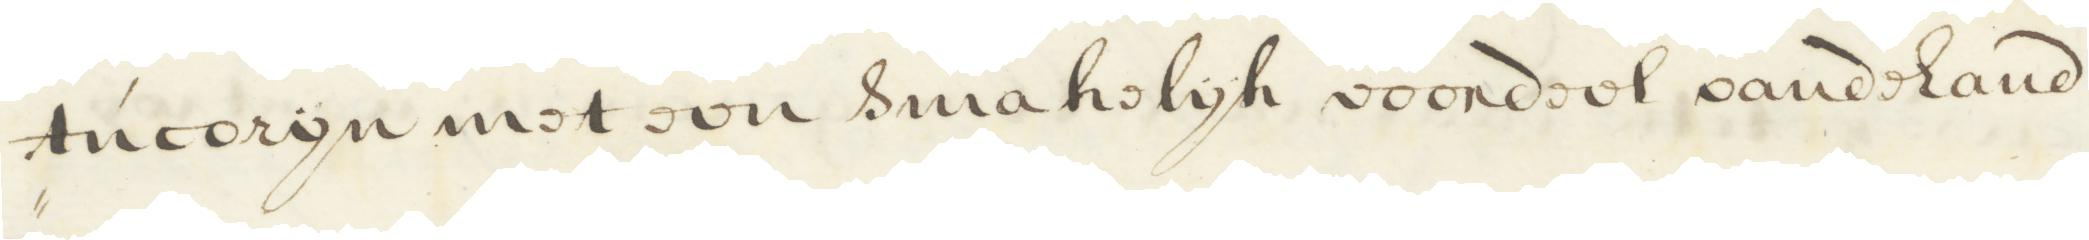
„tucorijn met een smakelijk voordeel vandehand
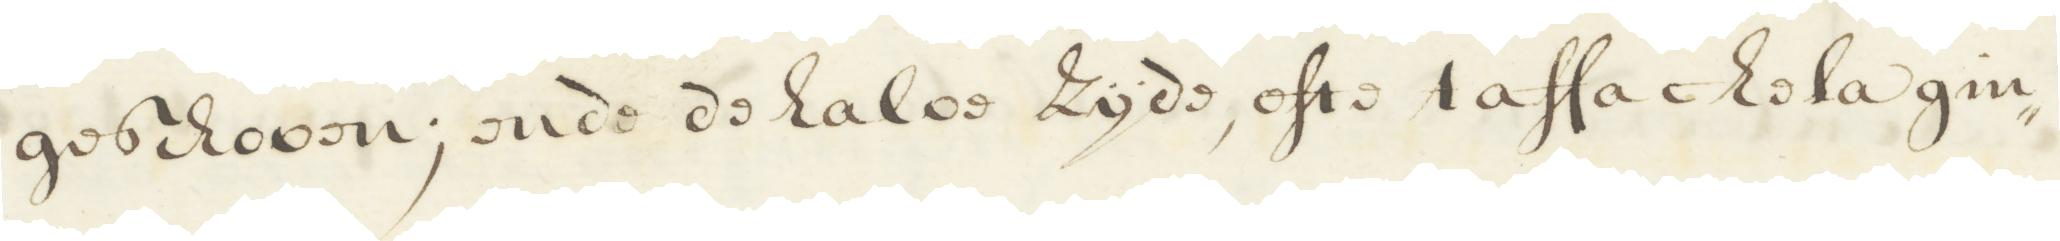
geschoven; ende de halve zijde, ofte taffachela gin„
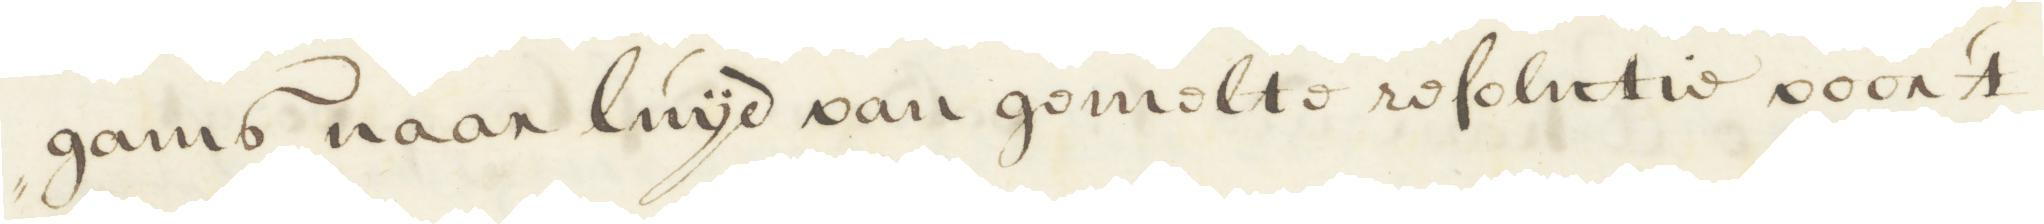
„gams, naar luijd van gemelte resolutie voor ’t
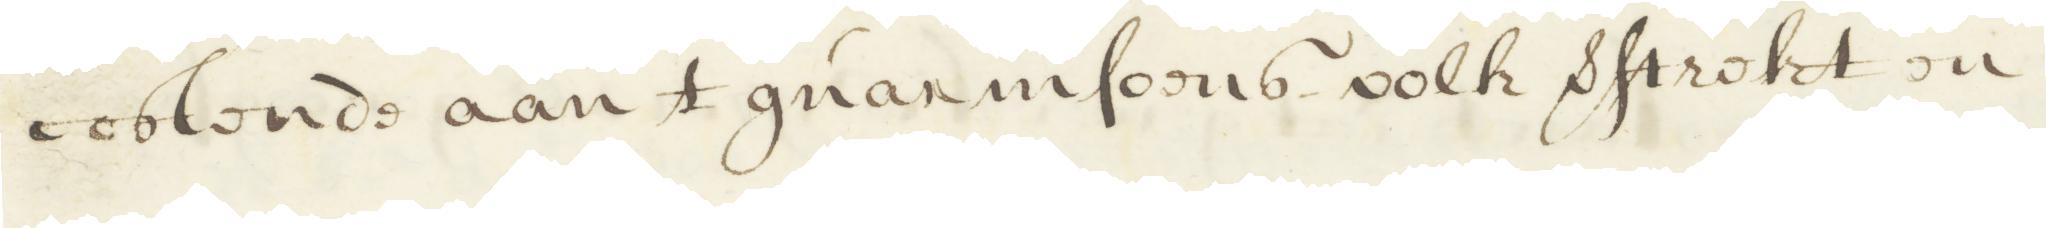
costende aan 't guarnisoens volk verstrekt en
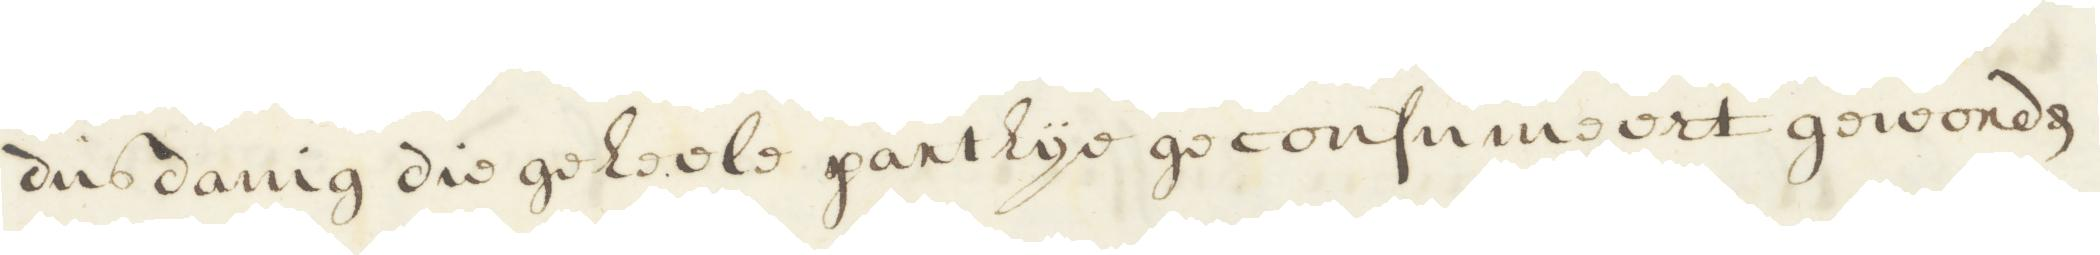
dusdanig die geheele parthije geconsumeert geworden
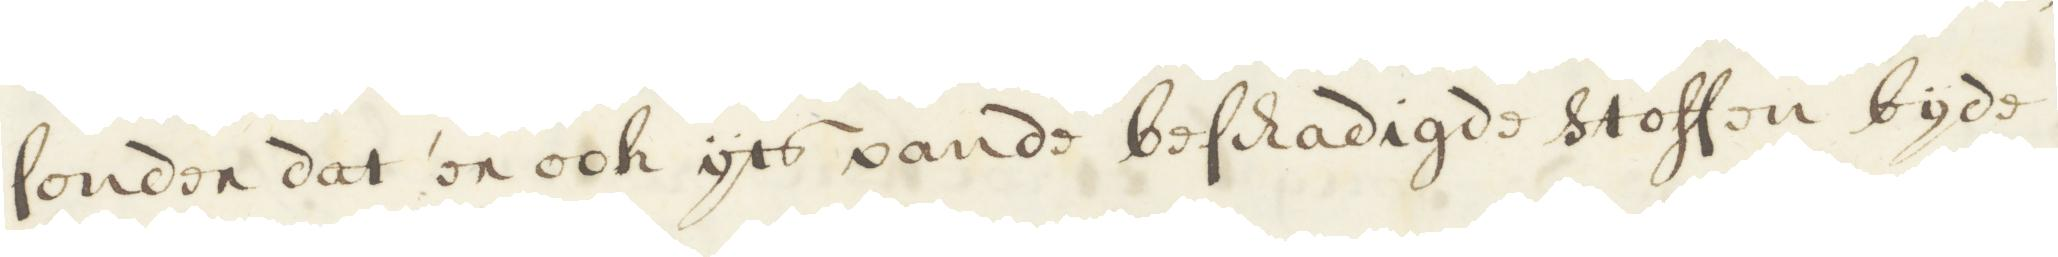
sonder dat 'er ook ijts vande beschadigde stoffen bij de
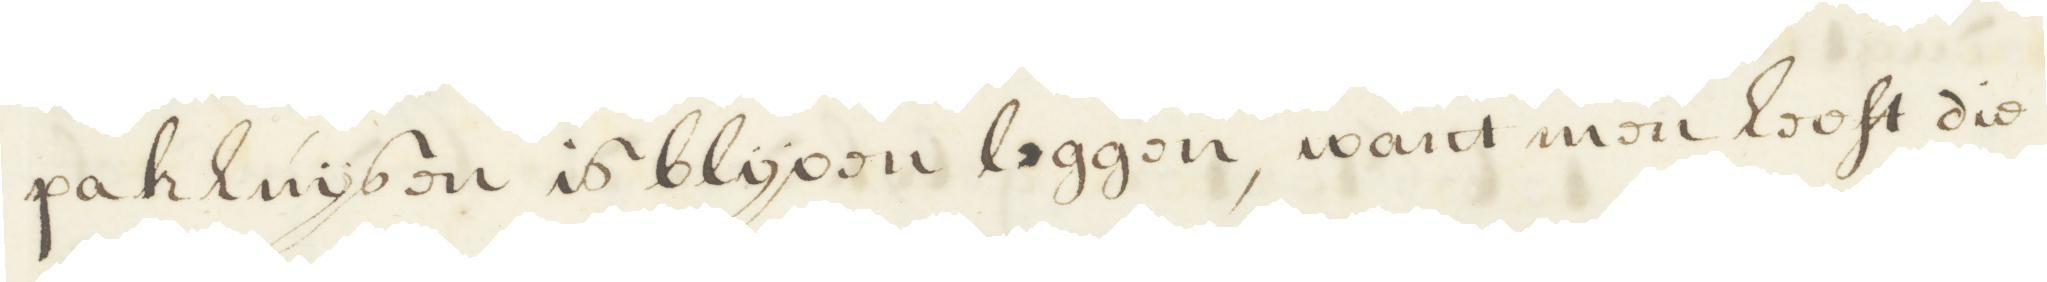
pakhuijsen is blijven leggen, want men heeft die
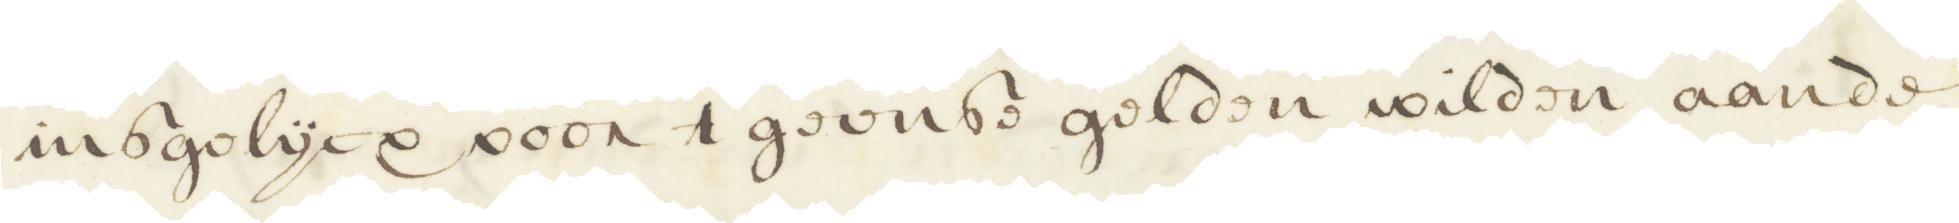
insgelijcx voor ’t geense gelden wilden, aan de
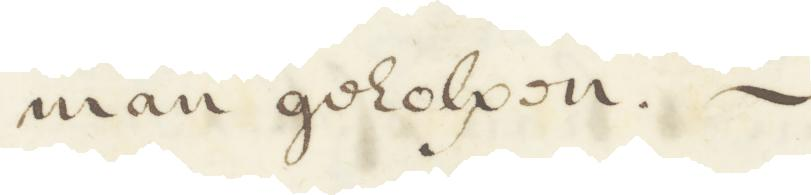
man geholpen.—
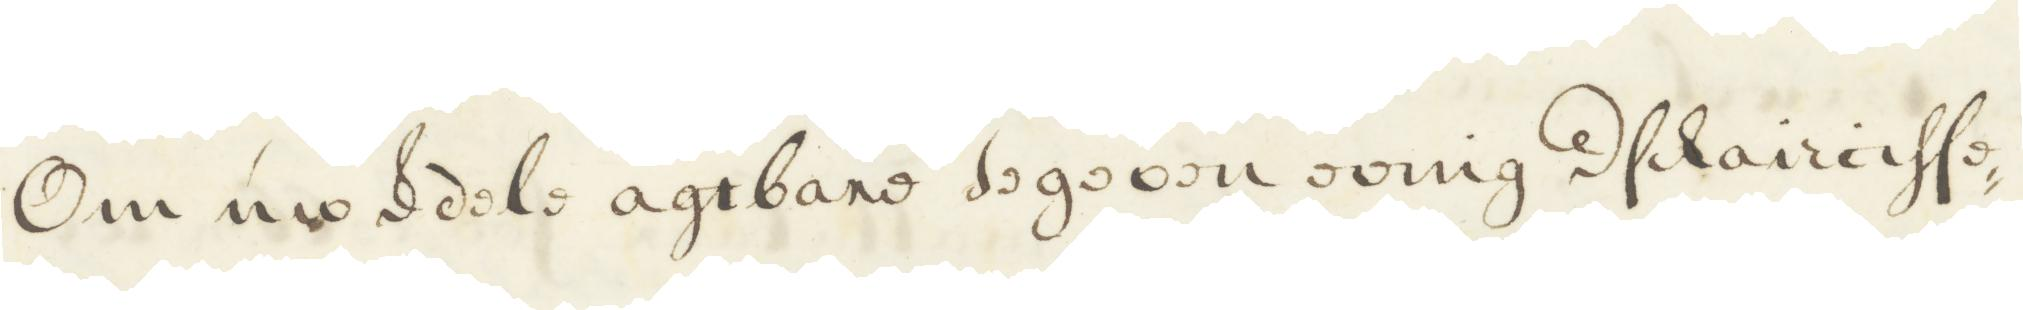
Om uw Edele agtbare te geven eenig Eschaircisse„
